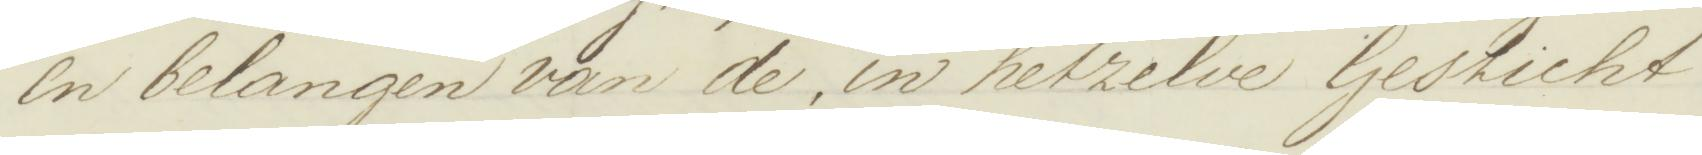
en belangen van de, in hetzelve Gesticht
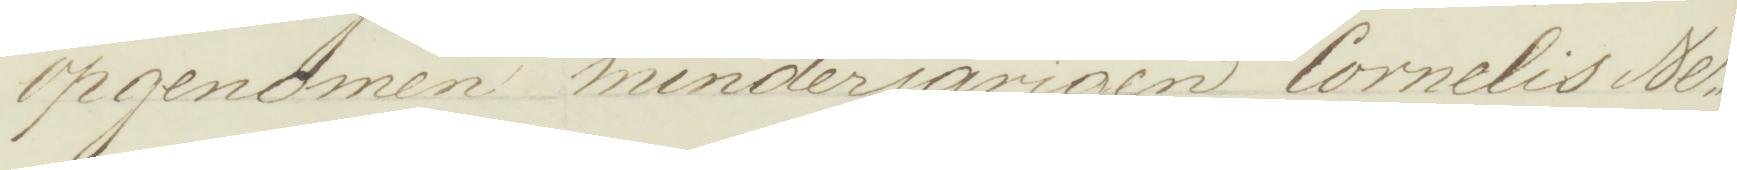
opgenomen minderjarigen Cornelis Ne„
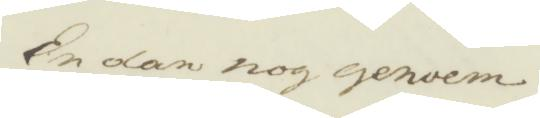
En dan nog genoem
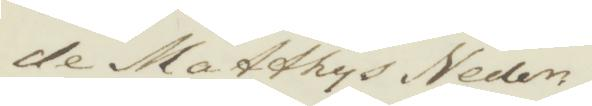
de Matthijs Neder,
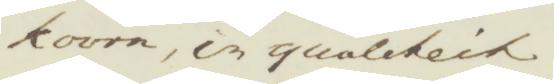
koorn, in qualiteit
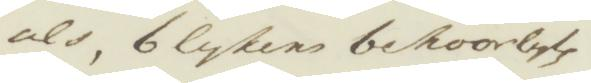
als, blykens behoorlyk
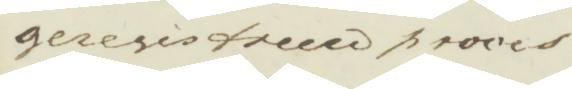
geregistreerd proces
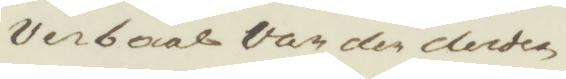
verbaal van den derden
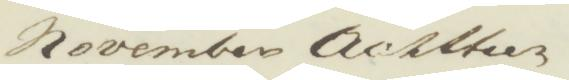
November Achttien
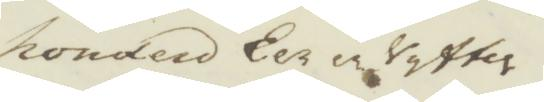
honderd Een en Vyftig
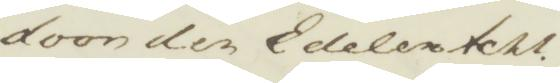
door den Edelen Acht.
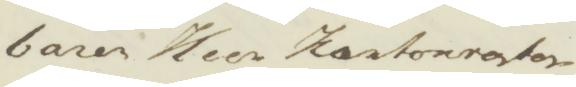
baren Heer kantonregter
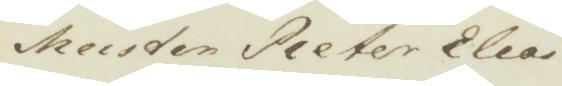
Meesten Pieter Elias
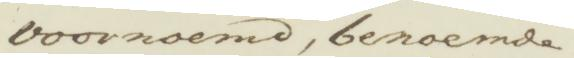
voornoemd, benoemde
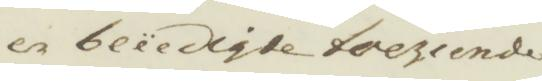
en beëedigde toeziend
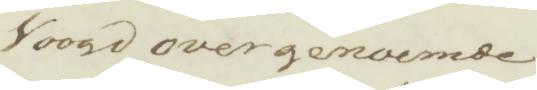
Voogd over genoemde
